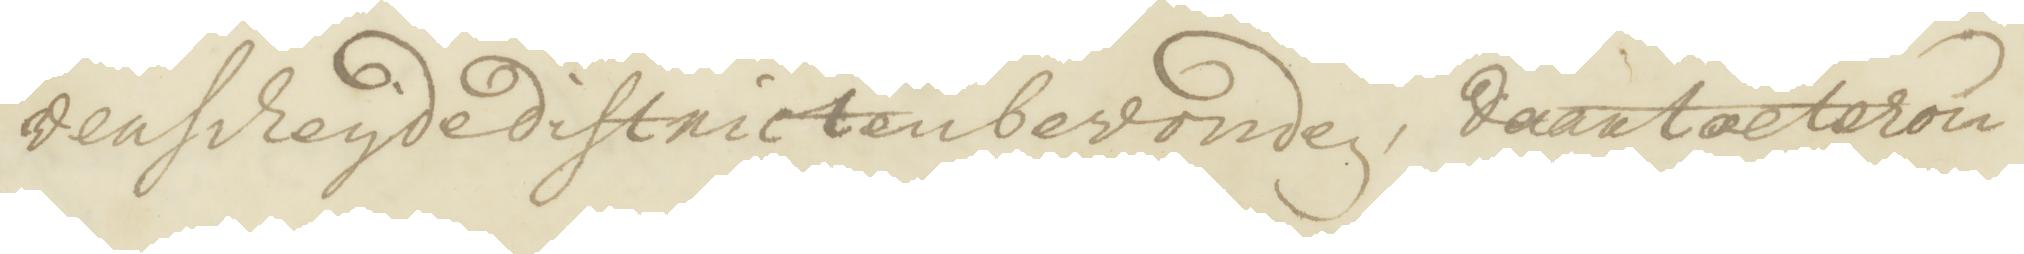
verscheijde districten bevonden, daartoetehou
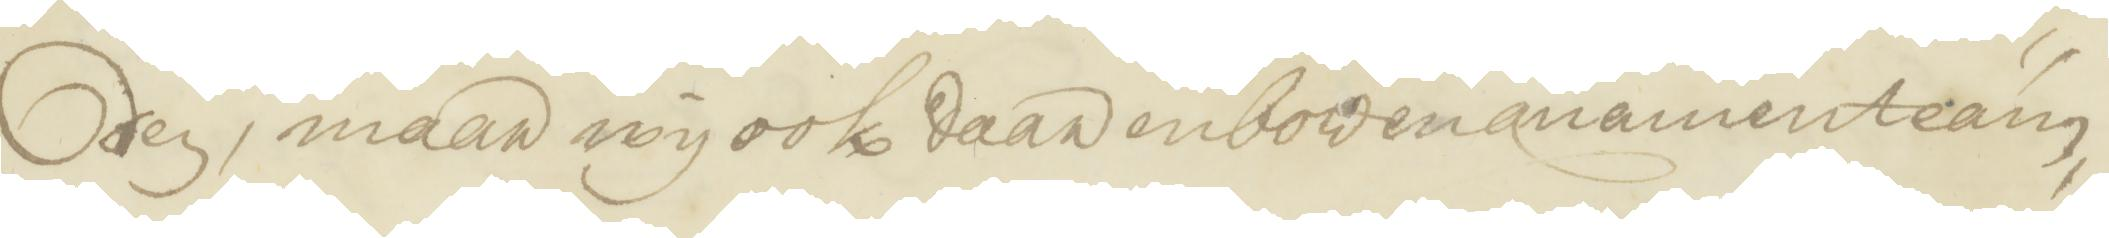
den, maar wij ook daar enboven quamen team„
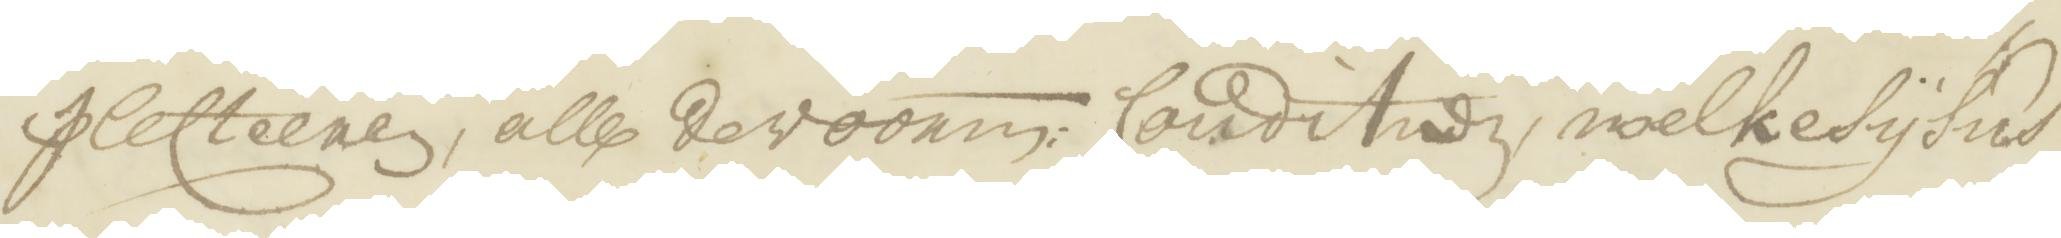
plecteeren, alle de voorm: Conditien, welke sij sus
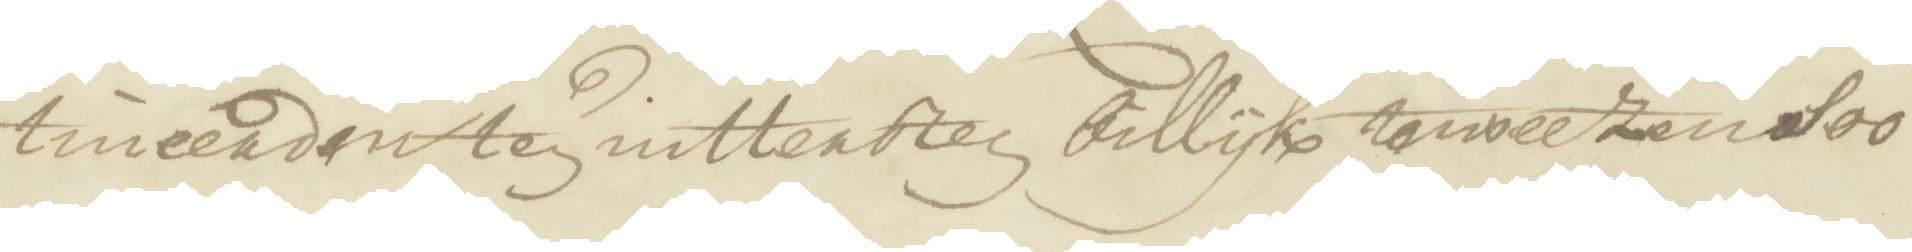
tineerden ten uittersten billijk teweezen soo
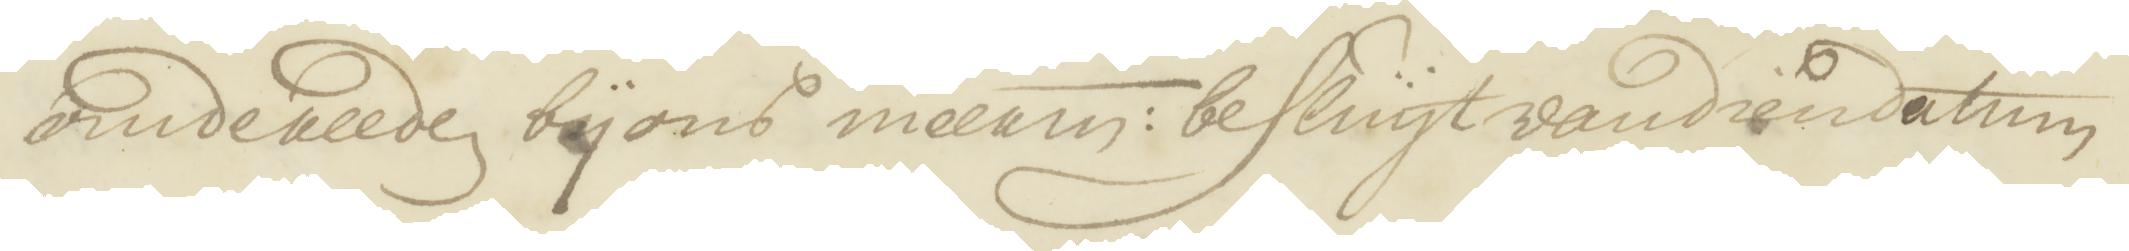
om de reeden bij ons meerm: besluijt van dien datum
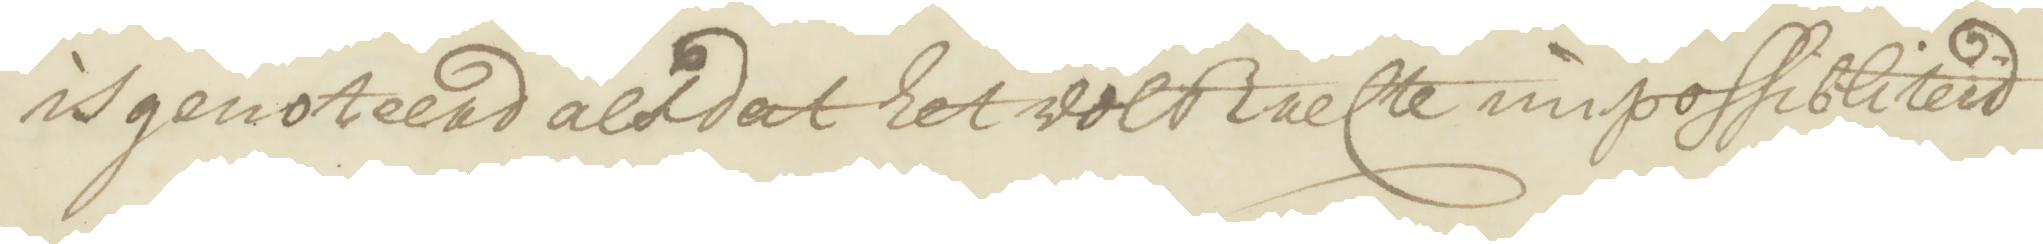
is genoteerd als dat het volstrecte impossibliteid
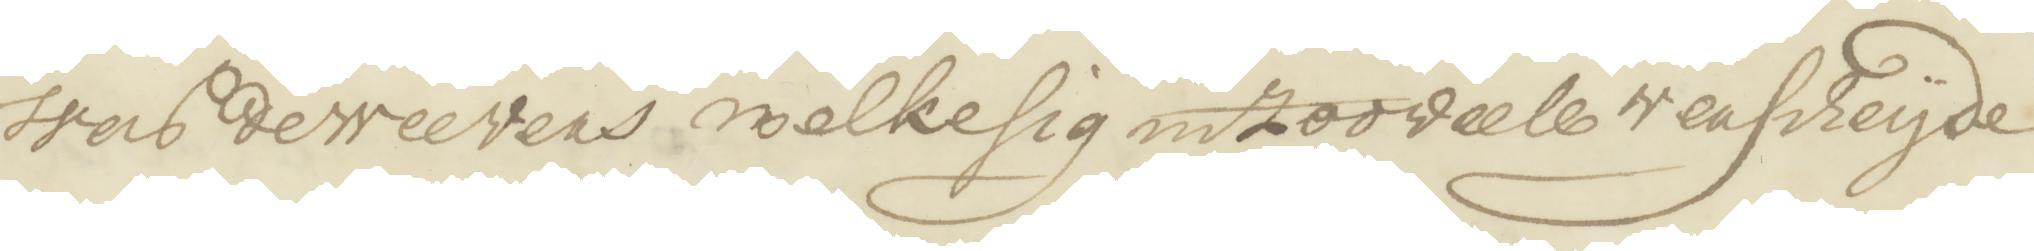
was deweevers welke sig inzooveele verscheijde
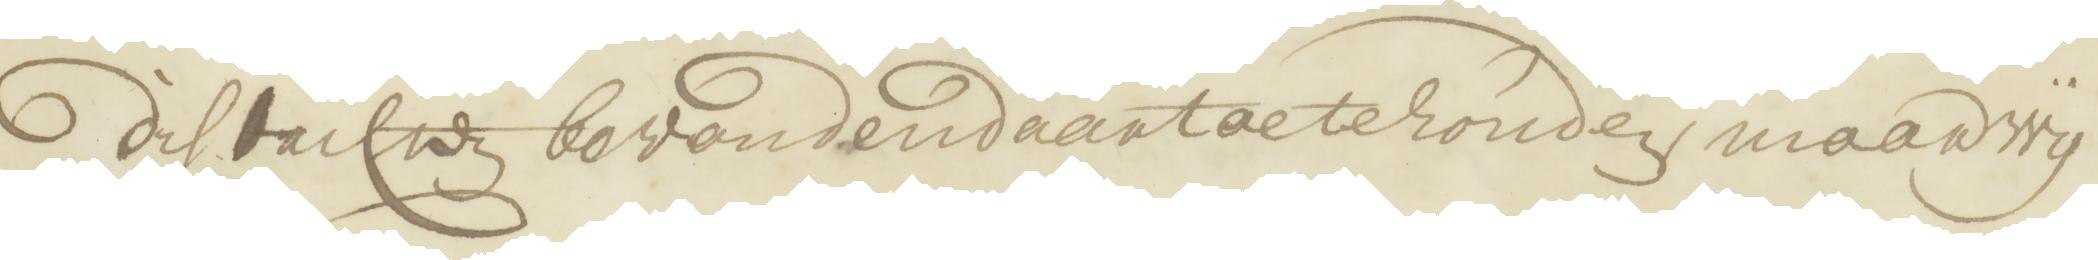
districten bevonden daartoete houden, maar wij
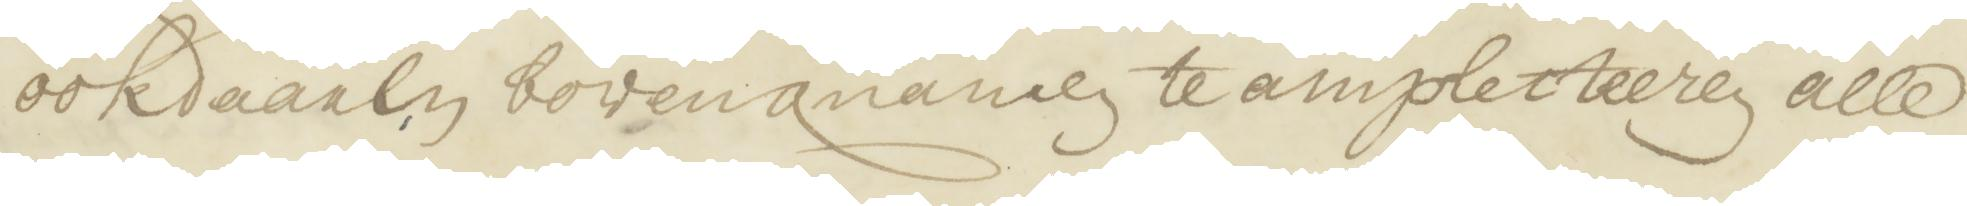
ook daaren boven quamen te amplecteeren alle
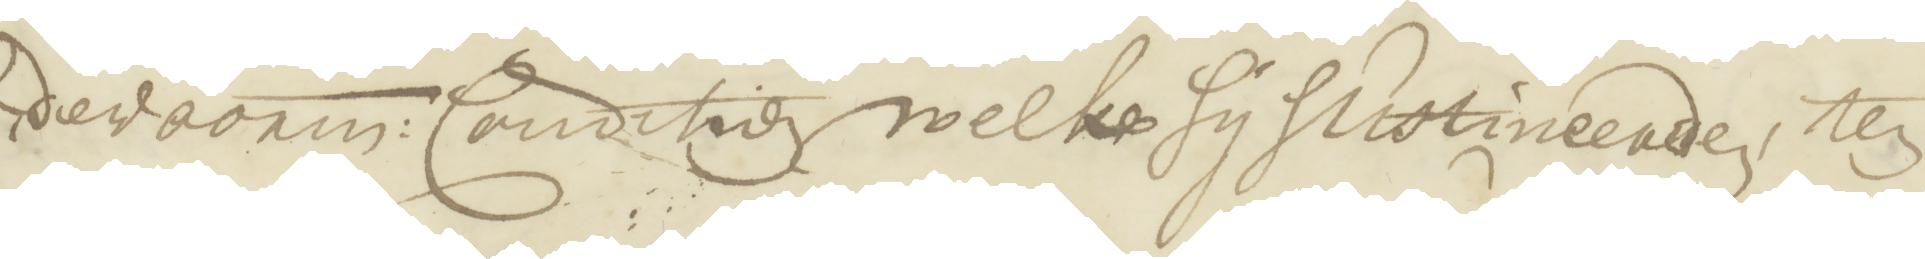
de voorm: Conditien welke sij sustineerden, ten
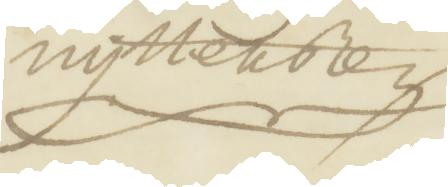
uijttersen
